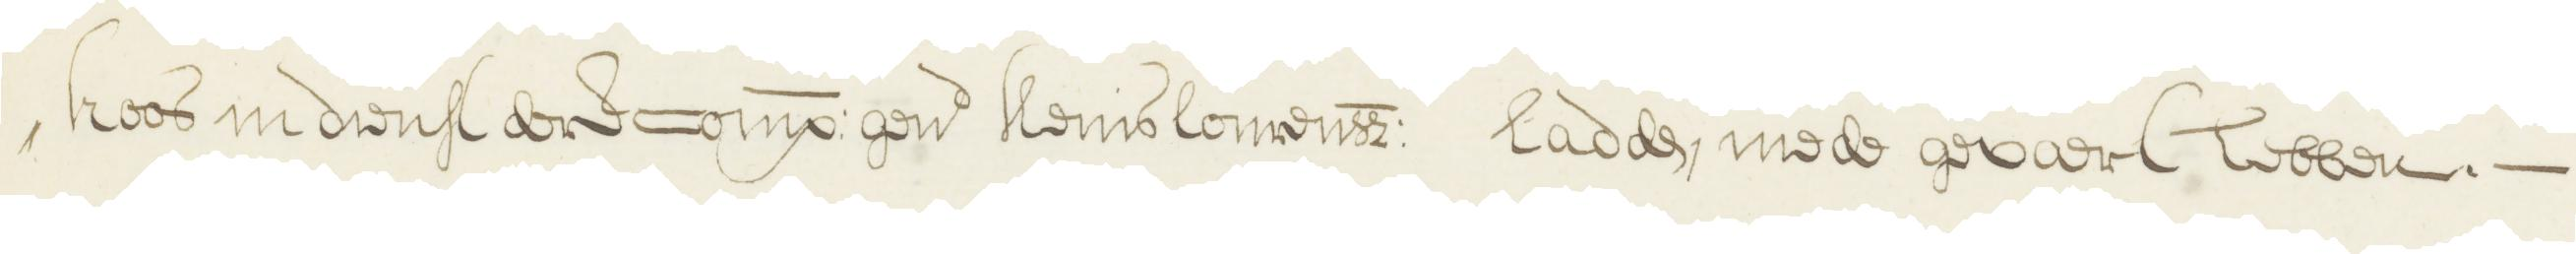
„troos in dienst der E comp: gend Henis lourensz: hadden, mede gevoert hebben. —
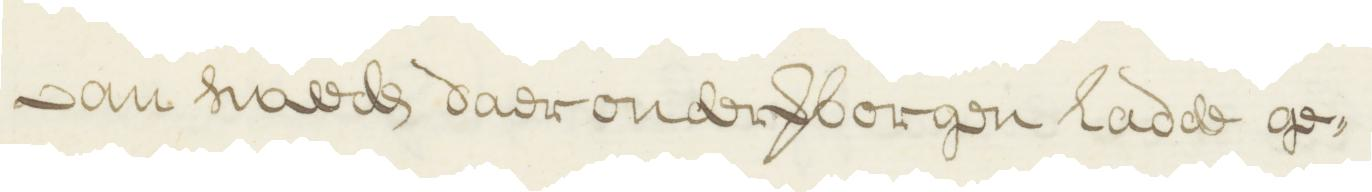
van sweeden daer onderverborgen hadde ge„
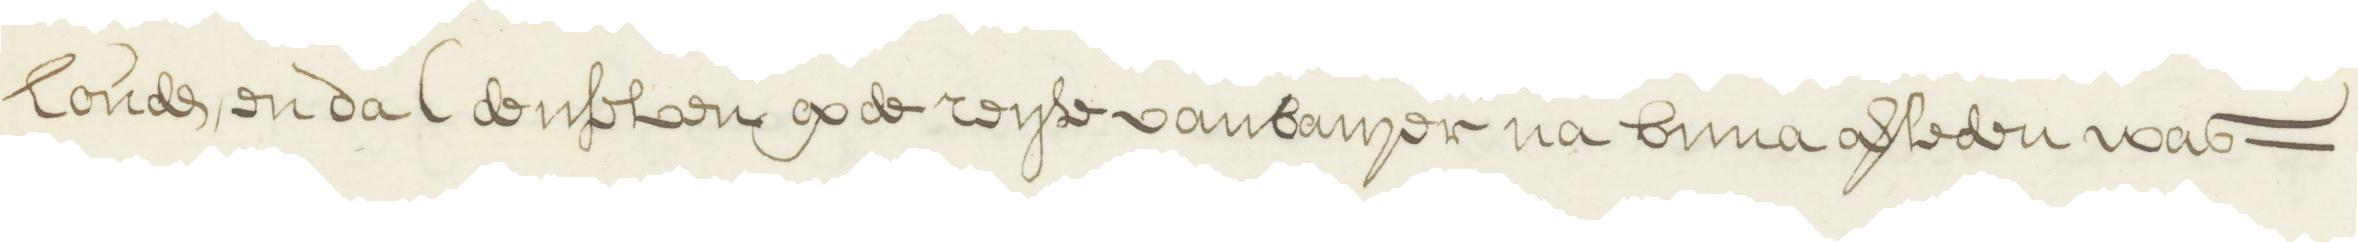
houden, en dat denselven op de reyse van banjer na bima overleden was—
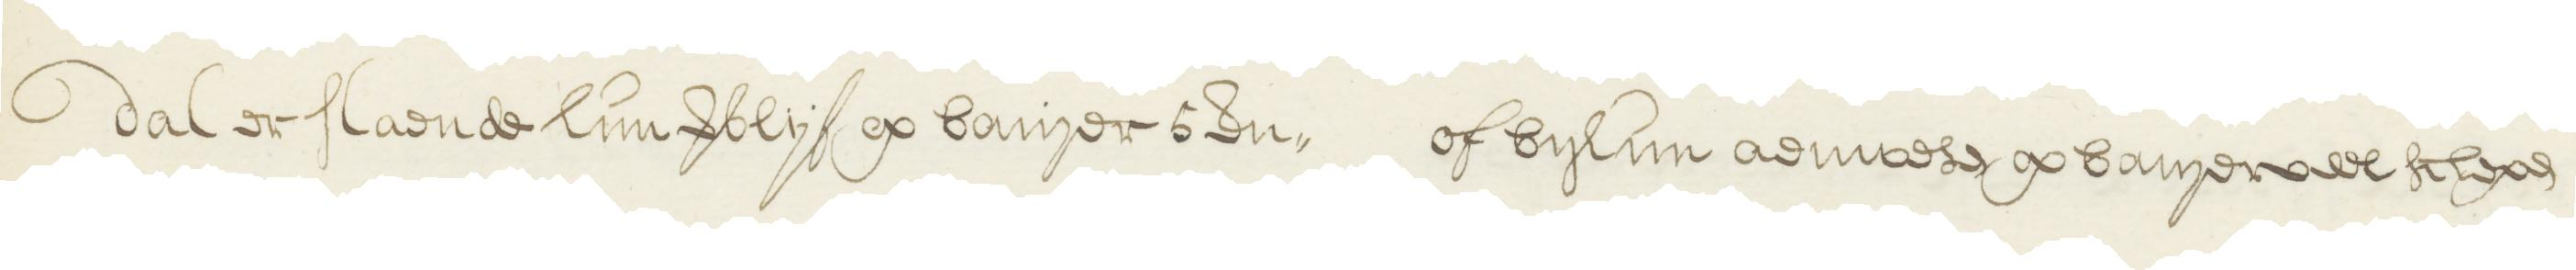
dat er staende hun verblijf op banjer 5 En„ of by hun aenwesen op banjer veel schepen
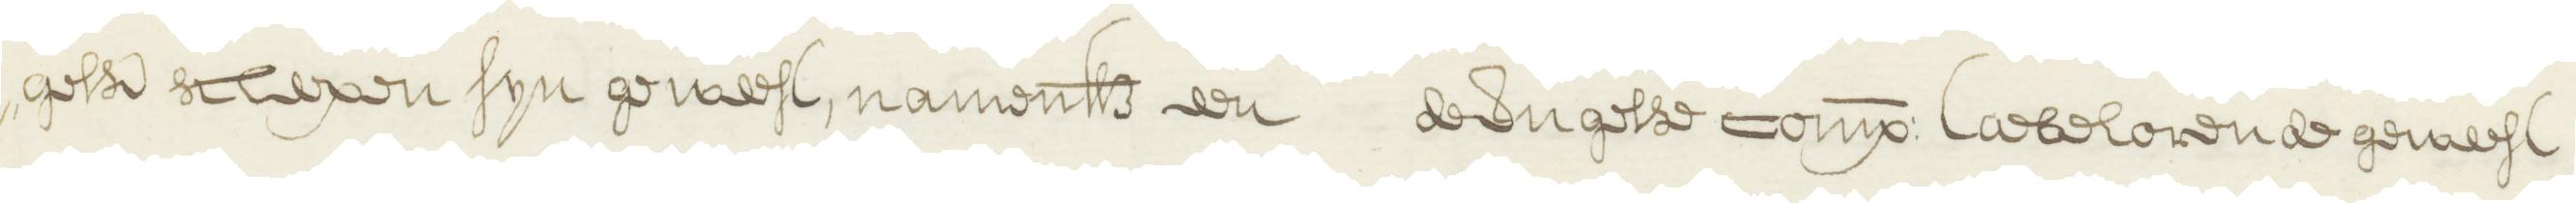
„gelse scheepen syn geweest, namentlz een de Engelse comp: toebehorende geweest
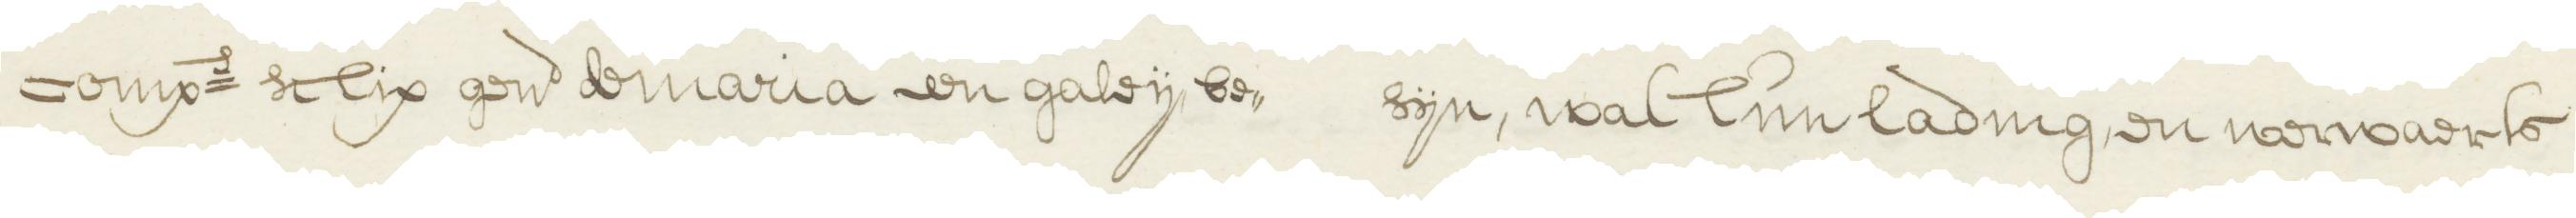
Comp=s schip gend de maria een galeij, be„ sijn, wat hun lading, en werwaerts
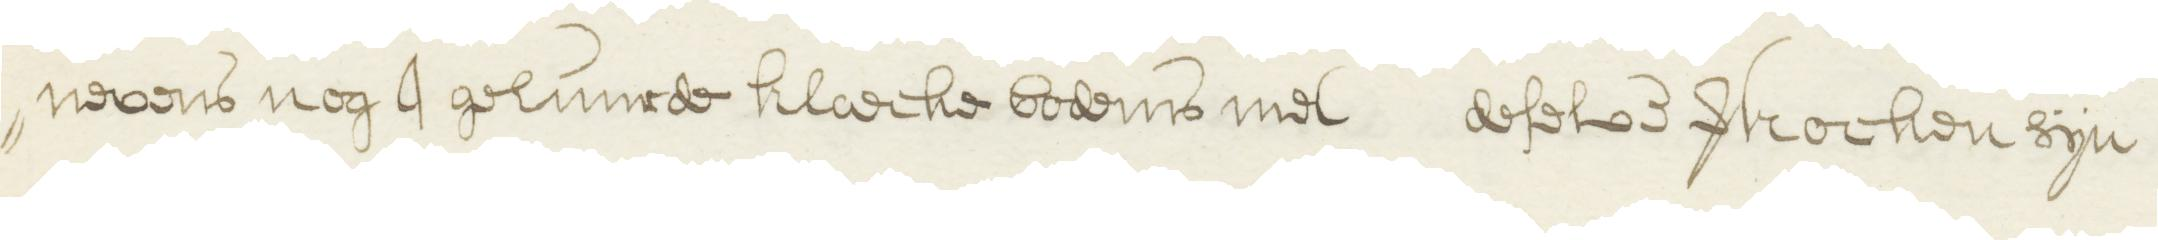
„nevens nog 4 gehuurde kloecke bodems met deselve vertrocken sijn
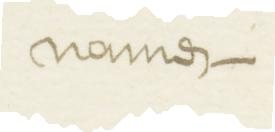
namen—
